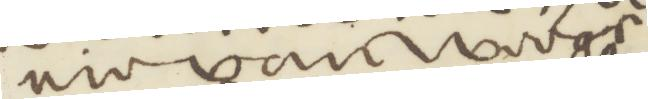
rie vanweegs
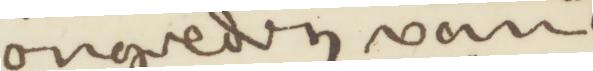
ongelden van
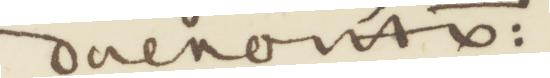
daer ontv:
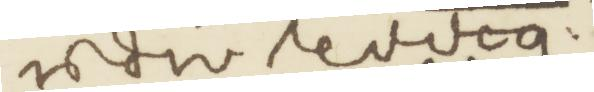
is die reecq:
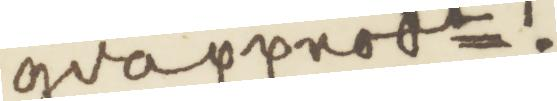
geapprob=t.
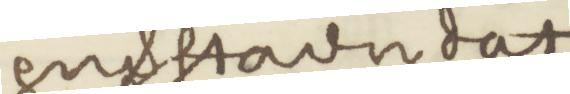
en verstaen dat
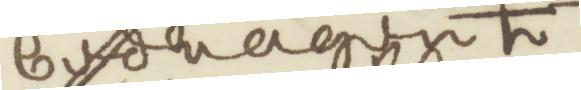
bedragen te
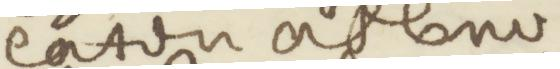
laten afbre
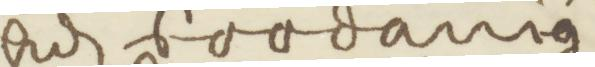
ken soodanig
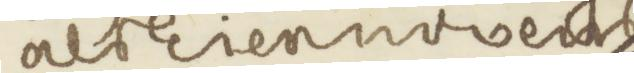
als hiernevens
